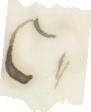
5„
